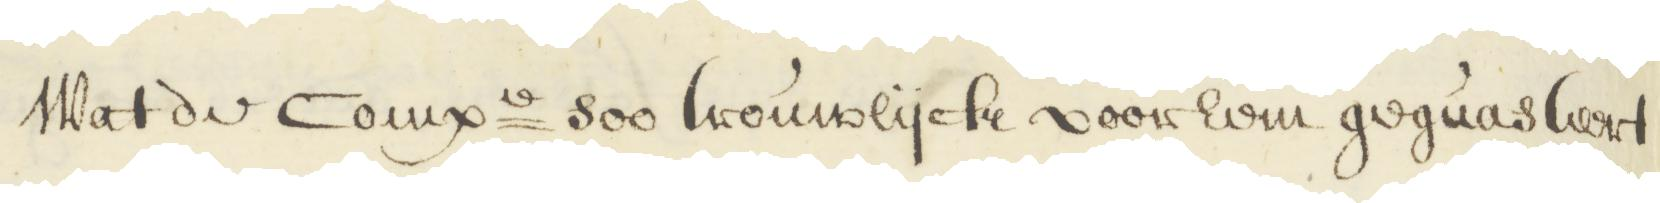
Wat de Comp=e soo trouwlijck voor hem geguasteert
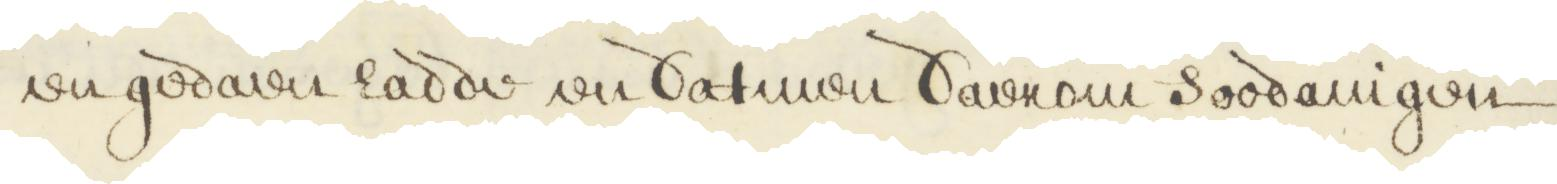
en gedaen hadde en datmen daerom soodanigen
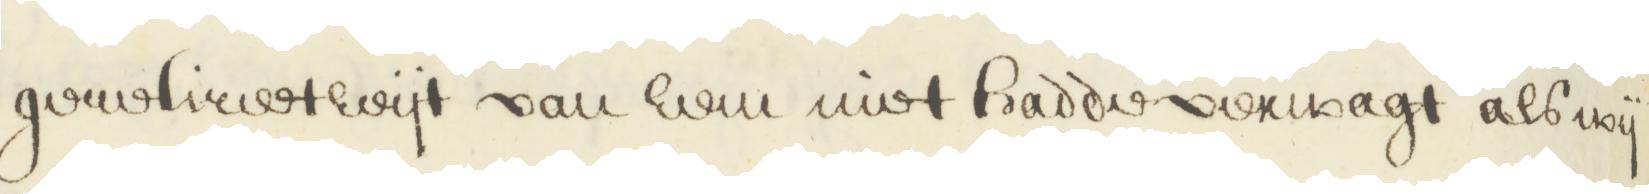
geretireetheijt van hem niet hadde verwagt als wij
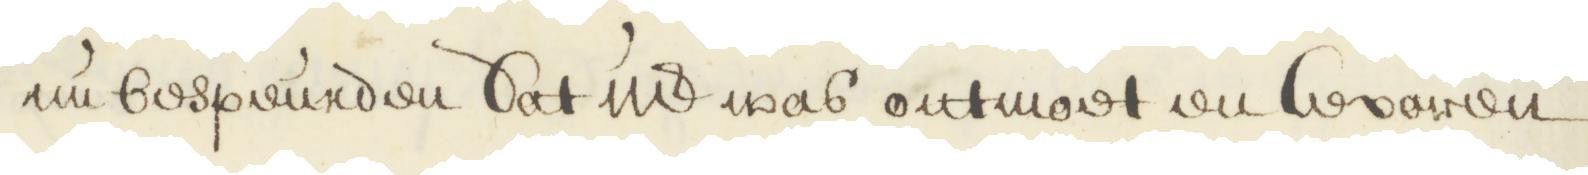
nu bespeurden dat UE was ontmoet en tevoren
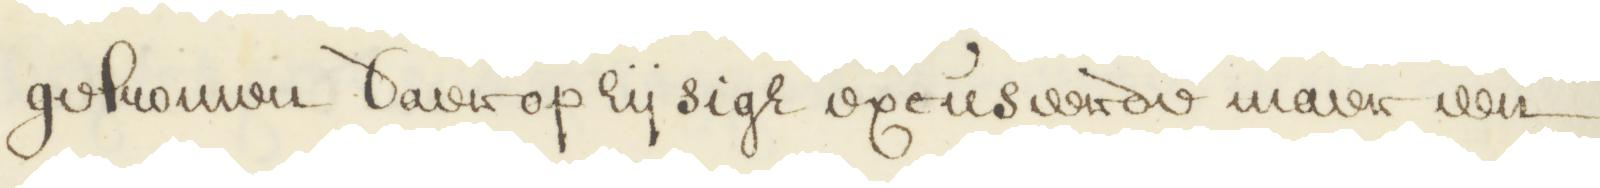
gekomen daer op hij sigh excuseerde maer een
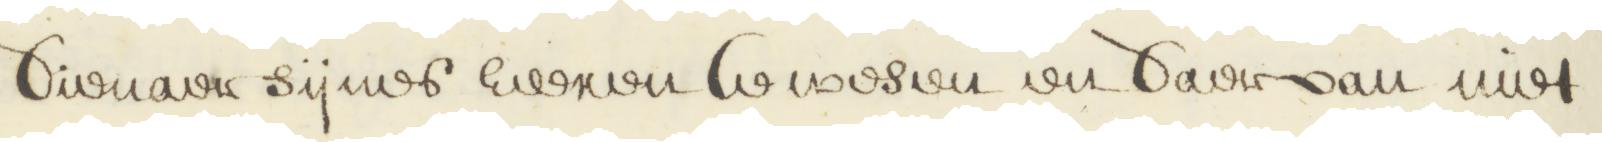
dienaer sijnes heeren te wesen en daer van niet
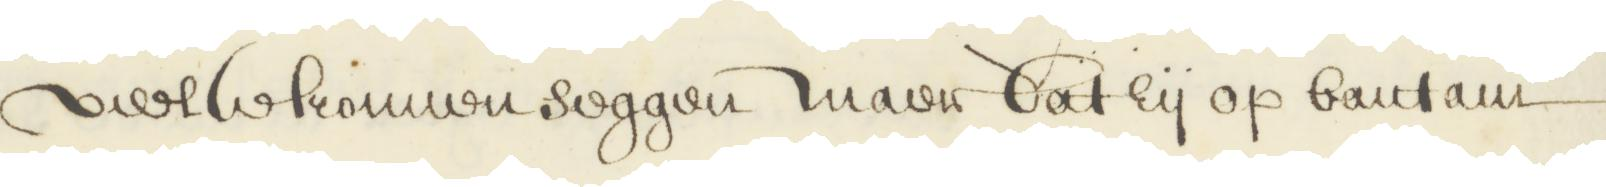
veel te konnen seggen maer dat hij op bantam
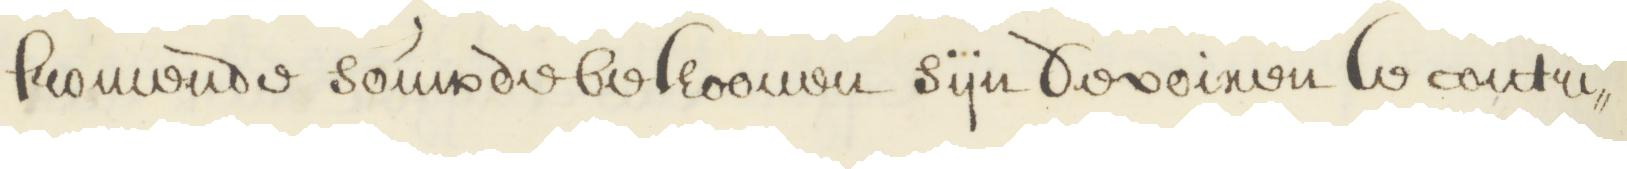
komende souw de bethoonen sijn devoiren te contri„
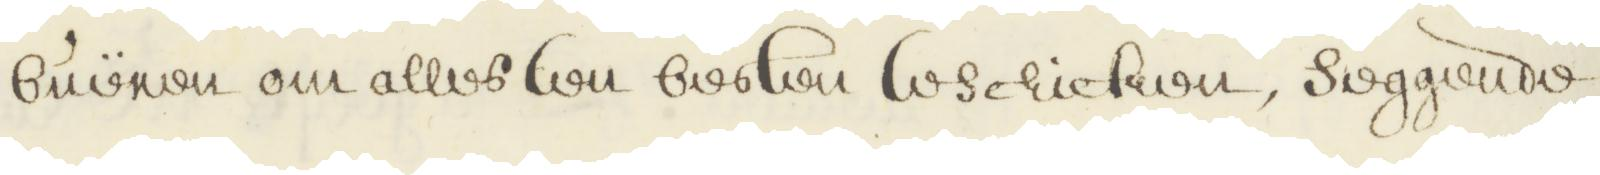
buëren om alles ten besten te schicken, seggende
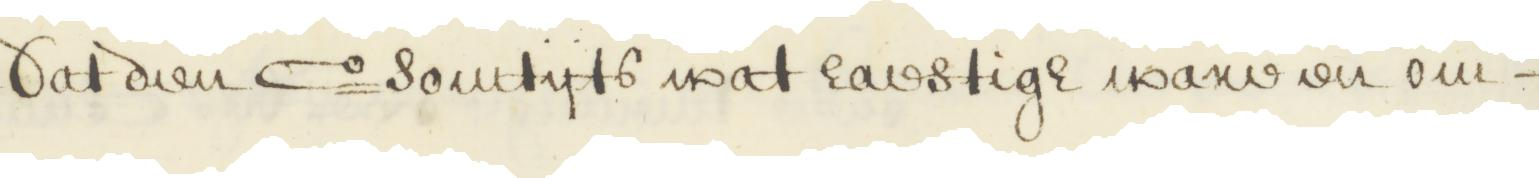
dat den c=o somtijts wat haestigh ware en om
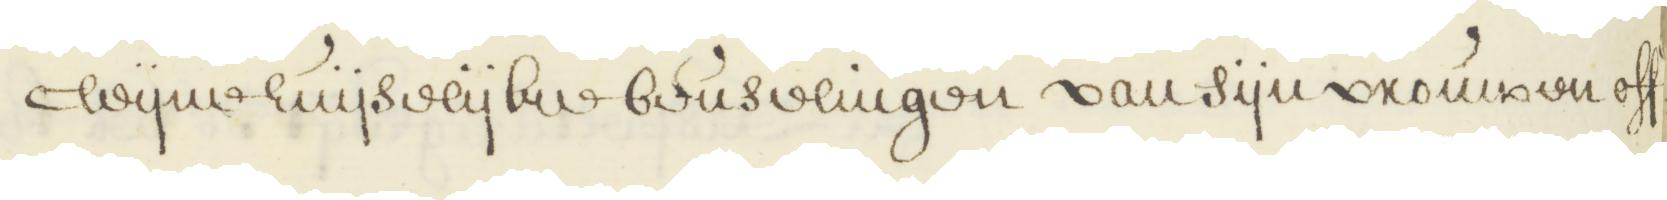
cleijne huijselijke beuselingen van sijn vrouwen off
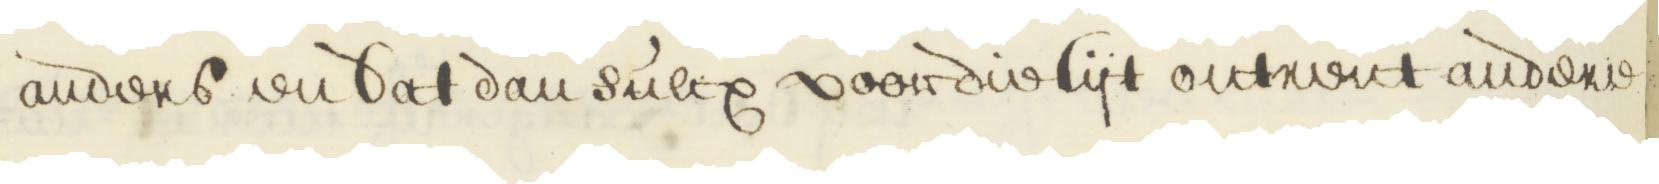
anders en dat dan sulcx voor die tijt ontrent andere
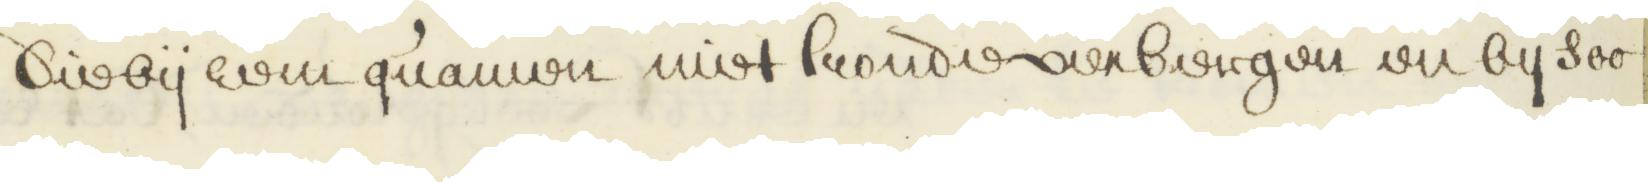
die bij hem quamen niet konde verbergen en bij soo
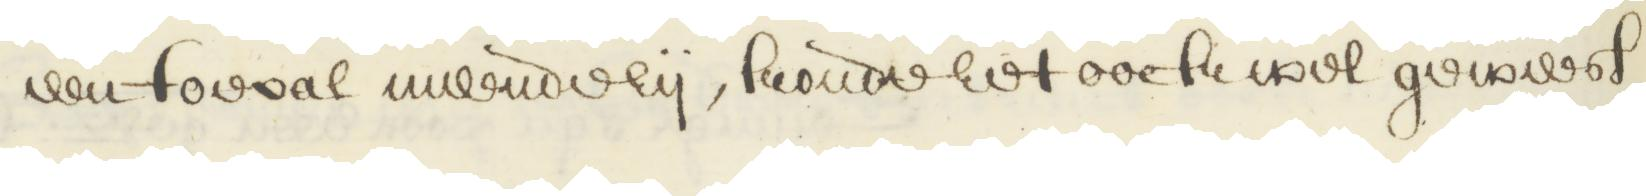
een toeval meende hij, konde het oock wel geweest
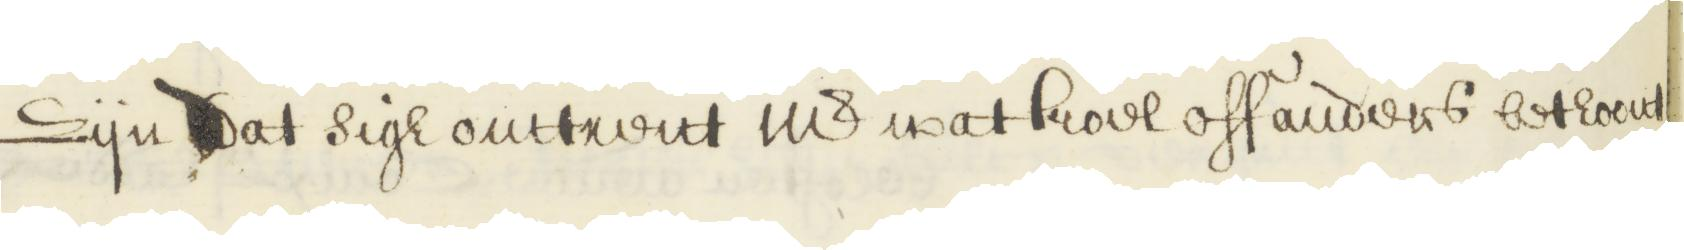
zijn dat sigh omtrent UE wat koel off anders bethoont
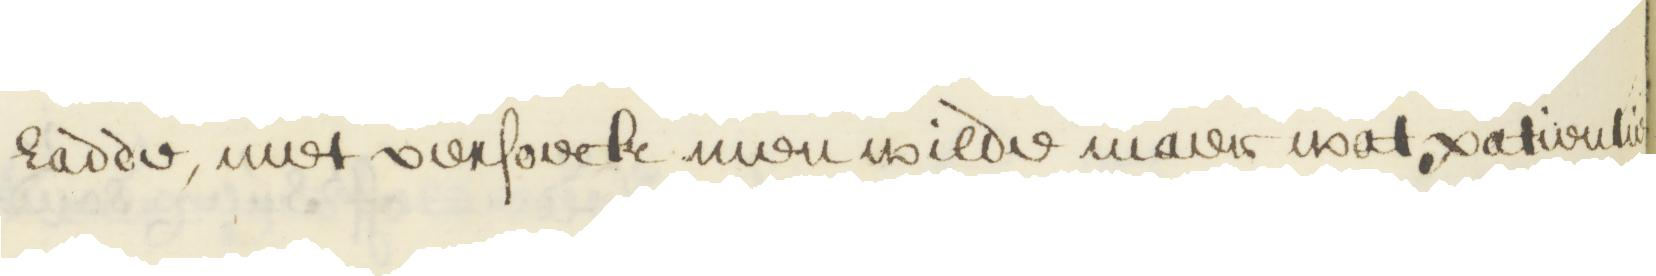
hadde, met versoeck men wilde maer wat patientie
